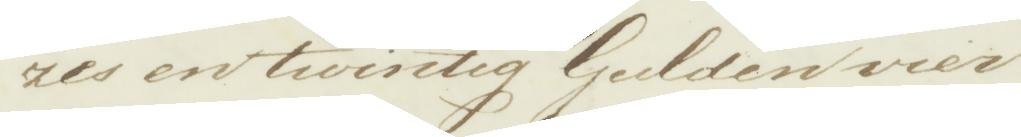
zes en twintig Gulden vier
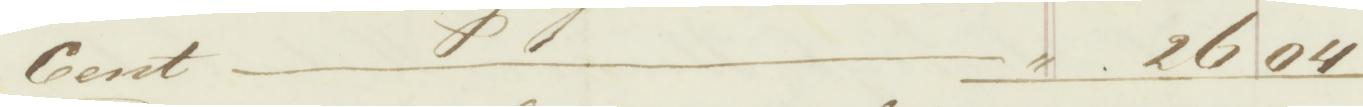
Cent —„ .26 04
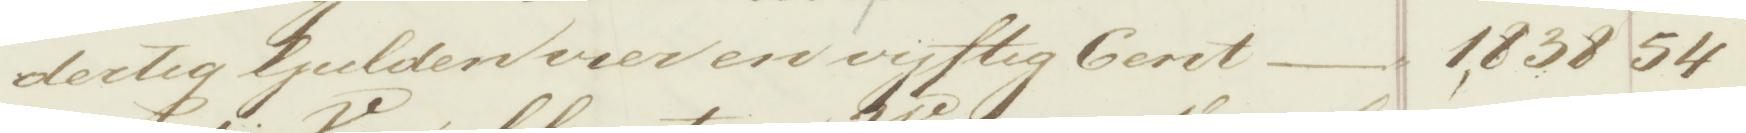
dertig Gulden vier en vijftig Cent— 1,838 54
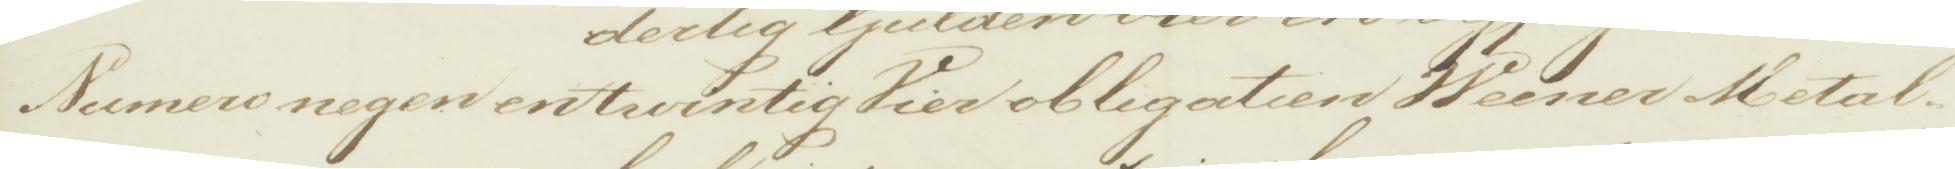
Numero negen en twintig Vier obligatien Weener Metal„
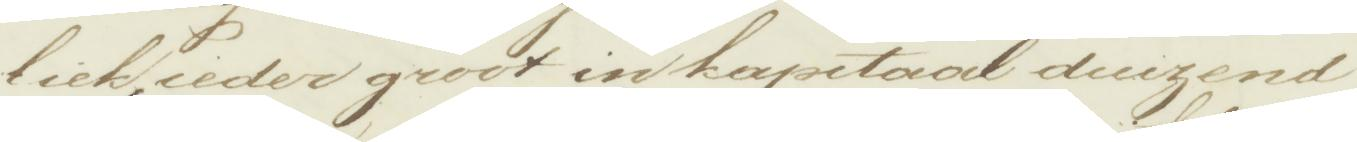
liek ieder groot in kapitaal duizend
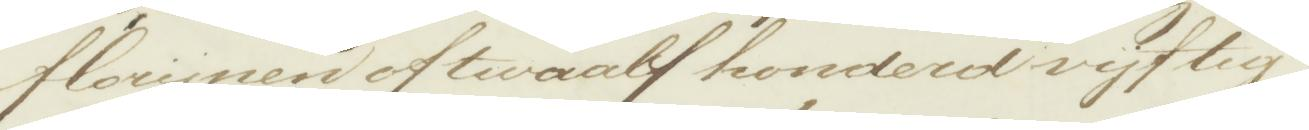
florijnen of twaalf honderd vijftig
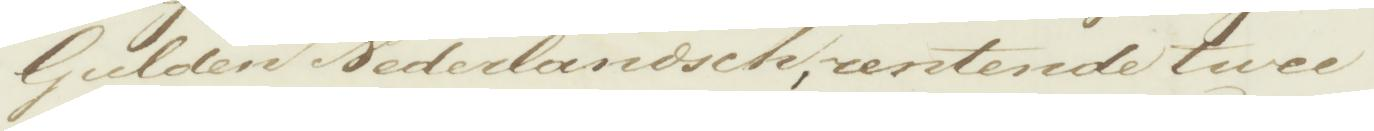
Gulden Nederlandsch, rentende twee
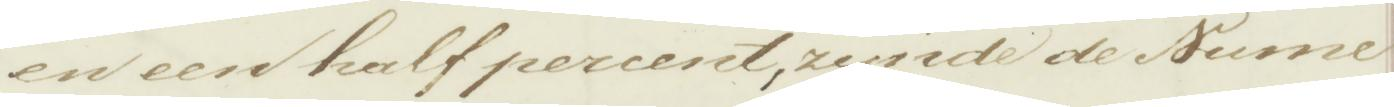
en een half percent, zynde de Nume
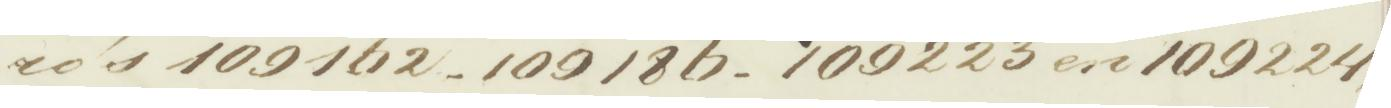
ro's 109162-109186- 109223 en 109224,
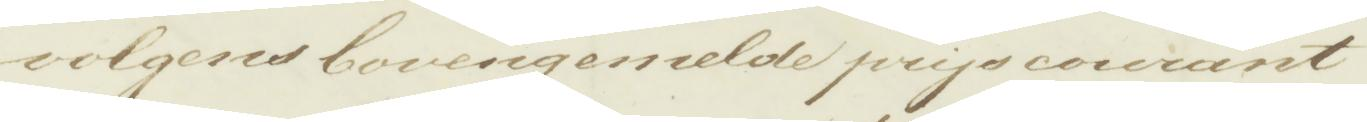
volgens bovengemelde prijs courant
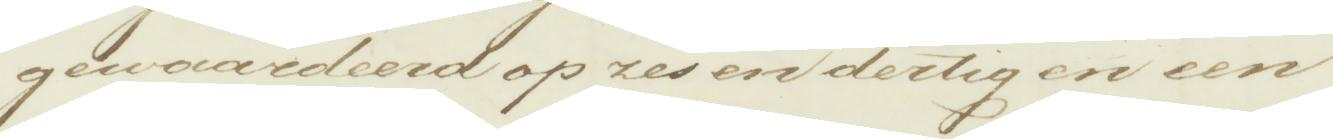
gewaardeerd op zes en dertig en een
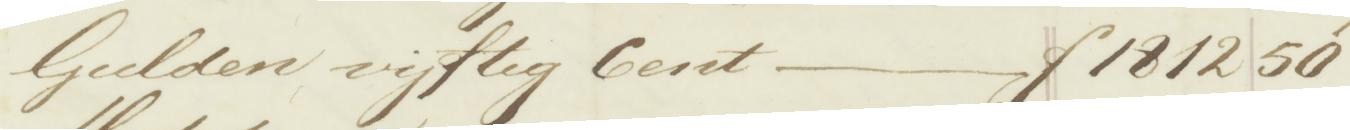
Gulden vijftig Cent — ƒ1812 50
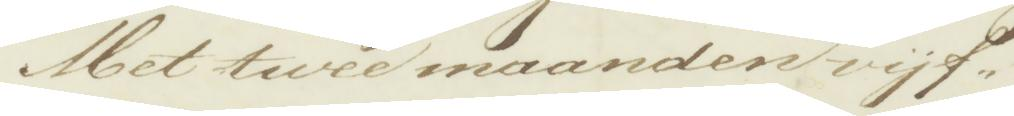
Met twee maanden vijf„
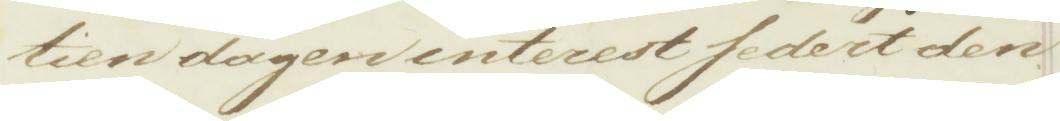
tien dagen interest sedert den
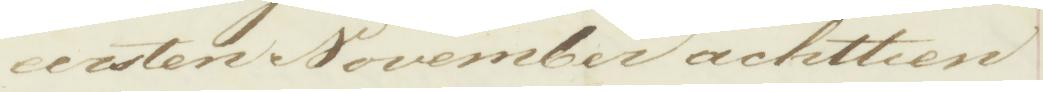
eersten November achttien
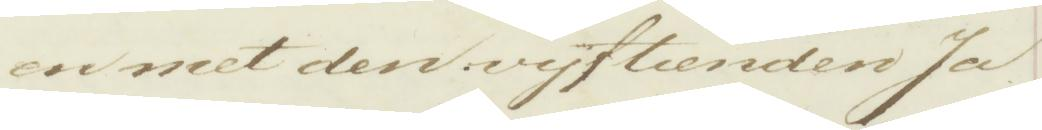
en met den vijftienden Ja„
